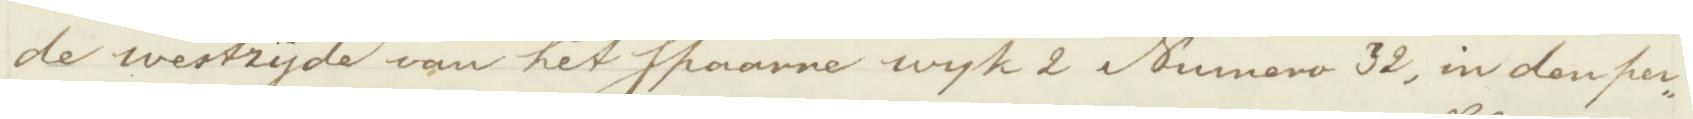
de westzijde van het spaarne wyk 2 Numero 32, in den per„
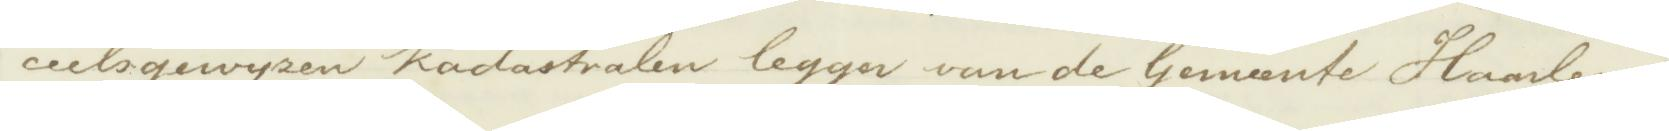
ceels gewyzen kadastralen legger van de Gemeente Haarlem
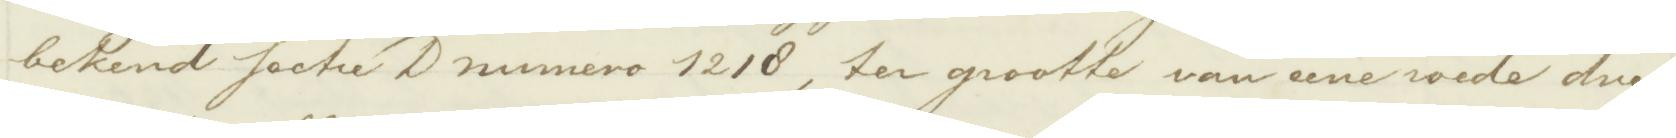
bekend sectie D numero 1218, ter grootte van eene roede drie
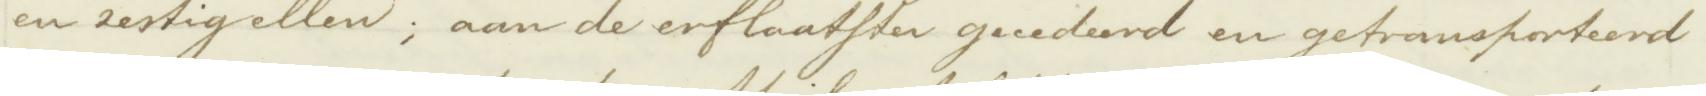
en zestig ellen; aan de erflaatster gecedeerd en getransporteerd
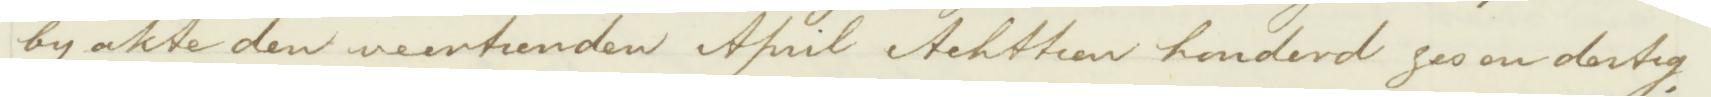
by akte den veertienden April Achttien honderd zes en dertig,
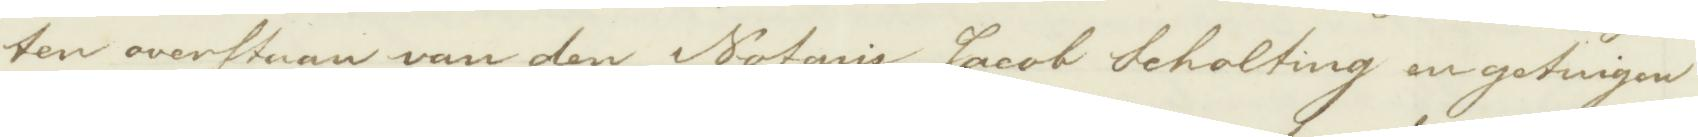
ten overstaan van den Notaris Jacob Scholting en getuigen
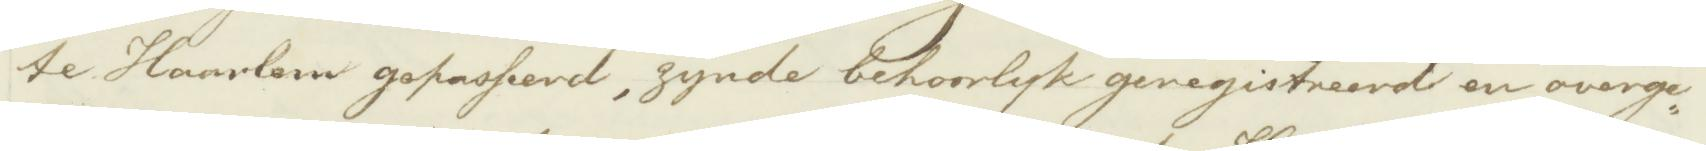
te Haarlem gepasseerd, zynde behoorlyk geregistreerd en overge„
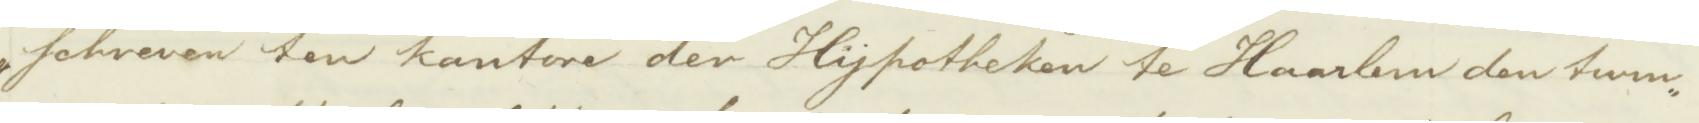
schreven ten kantore der Hijpotheken te Haarlem den twin„
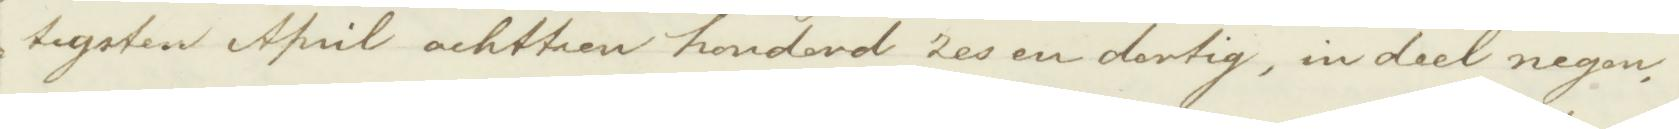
tigsten April achttien honderd zes en dertig, in deel negen,
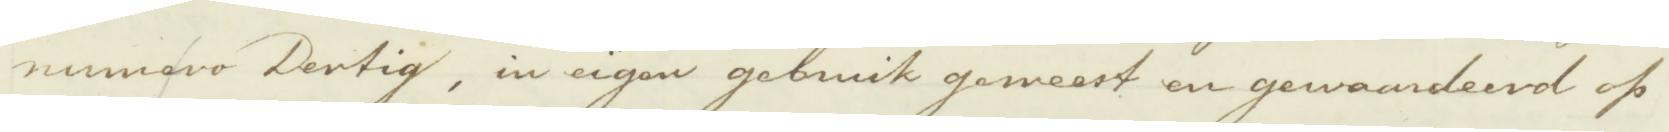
numero Dertig, in eigen gebruik geweest en gewaardeerd op
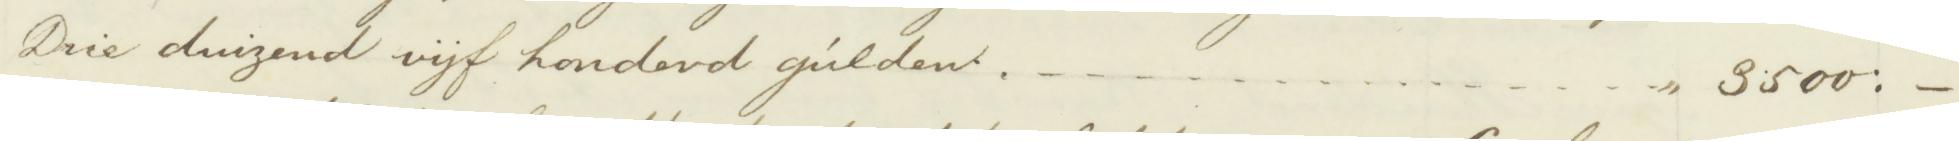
Drie duizend vijf honderd gulden. - - - - - - - - - - - - - - - „ 3500: —
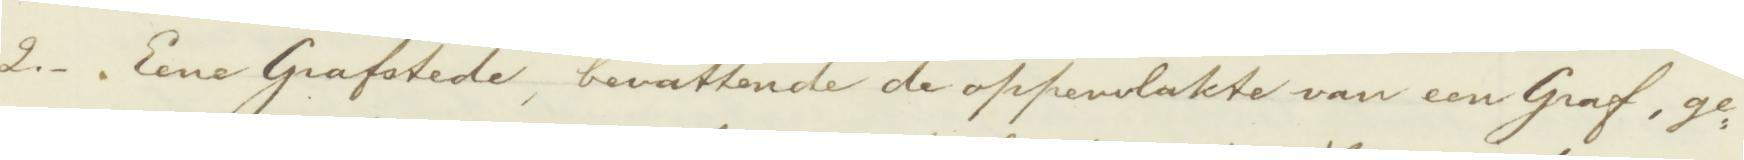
2.– . Eene Grafstede, bevattende de oppervlakte van een Graf, ge„
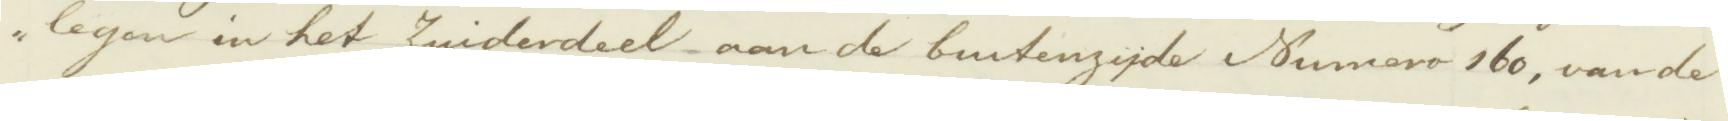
„legen in het Zuiderdeel - aan de buitenzijde Numero 160, van de
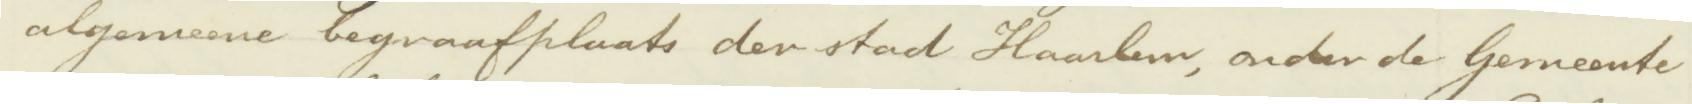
algemeene begraafplaats der stad Haarlem, onder de Gemeente
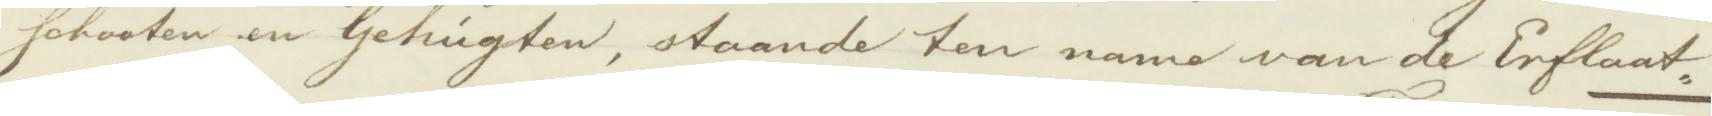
schooten en Gehugten, staande ten name van de Erflaat„
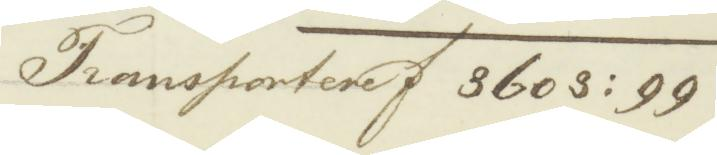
Transportere ƒ 3603: 99
